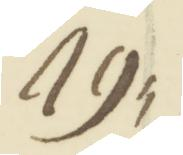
49:
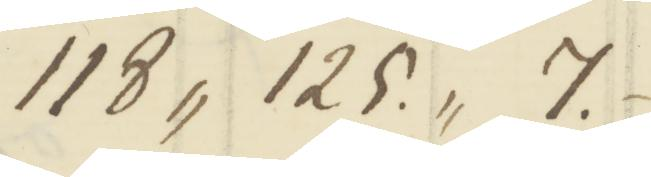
118„ 125.„ 7.
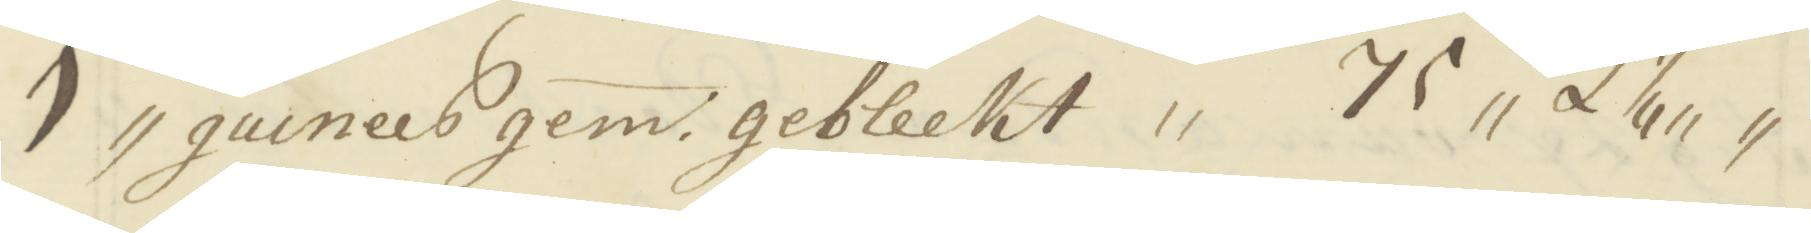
1 „ guinees gem: gebleekt „ 75 „ 2¼ „ „
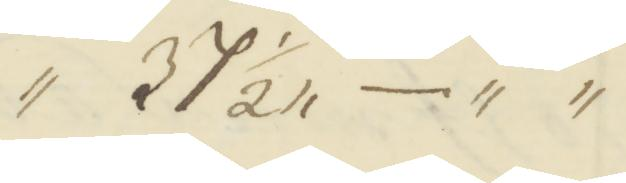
„ 37 ½ „ —„ „
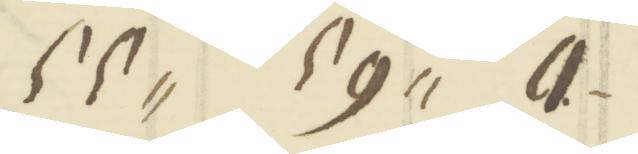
55„ 59„ 4.-
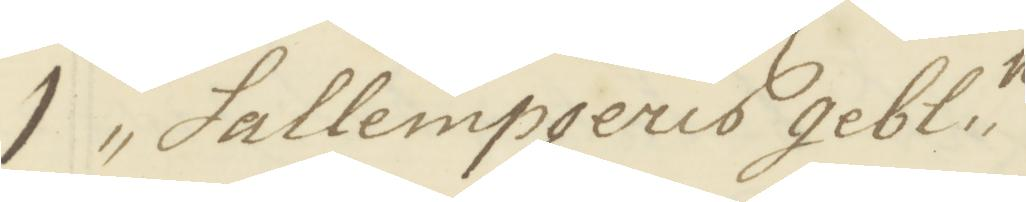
1 „ Sallempoeris gebl„kt
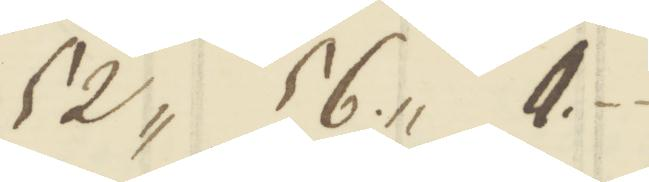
52„ 56.„ 4.
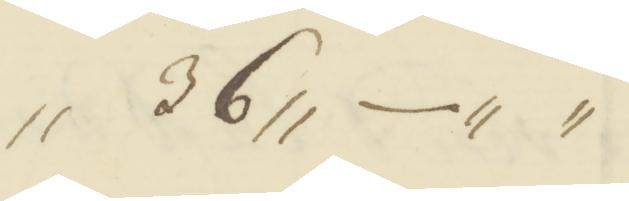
„ 36„ —„ „
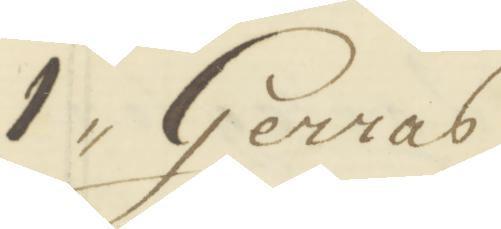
1 „ Gerras
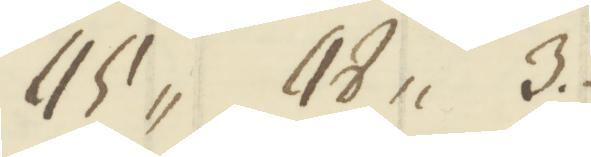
45 „ 48 „ 3.-
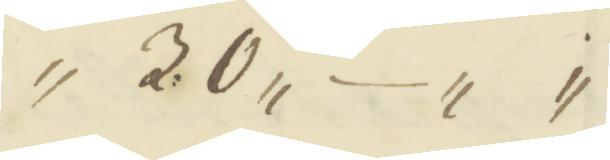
„ 30 „ —„ „
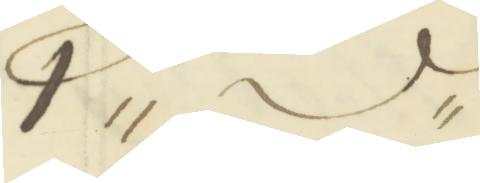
1„ d„o
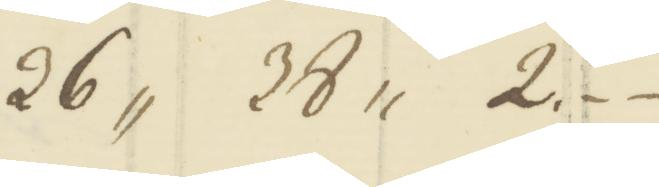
26 „ 38 „ 2:-—
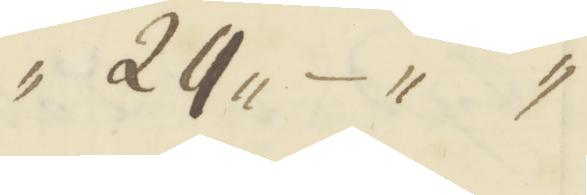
„ 24 „ — „ „
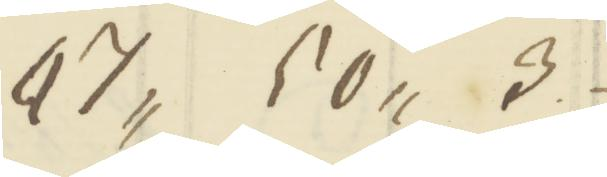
47„ 50„ 3.
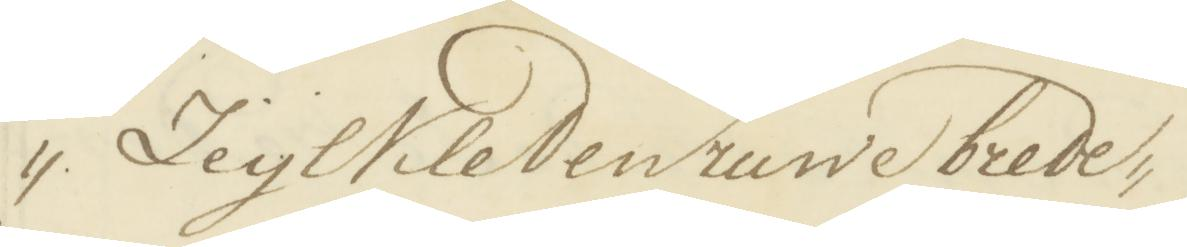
1 „ zeijlkleden ruwe brede „
